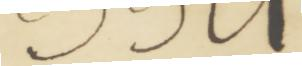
334
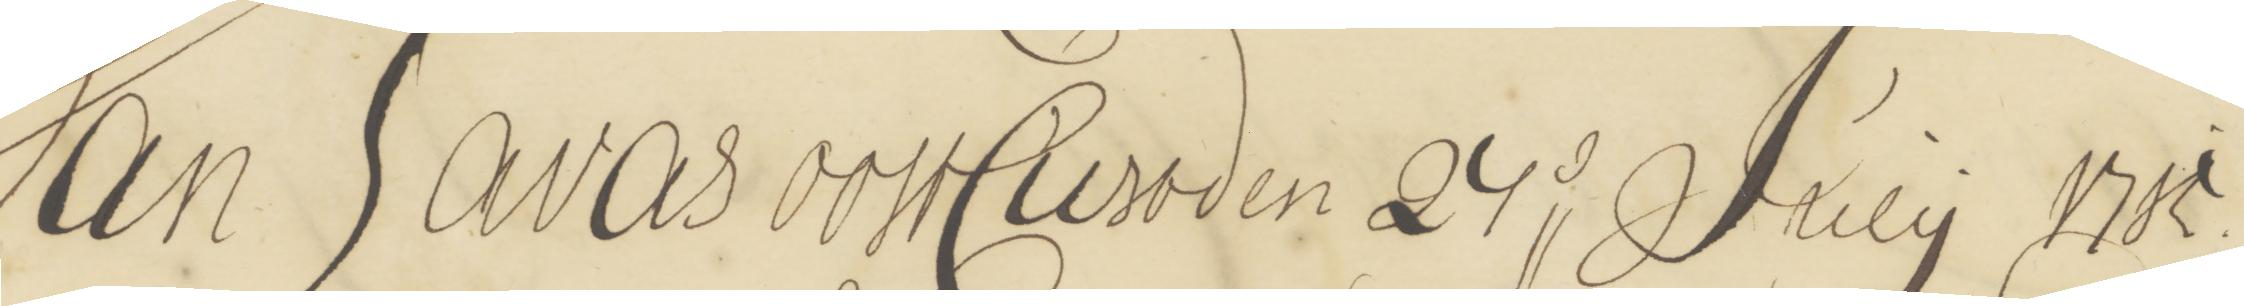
Van Javas oost Cust den 27„e Julij 1715.
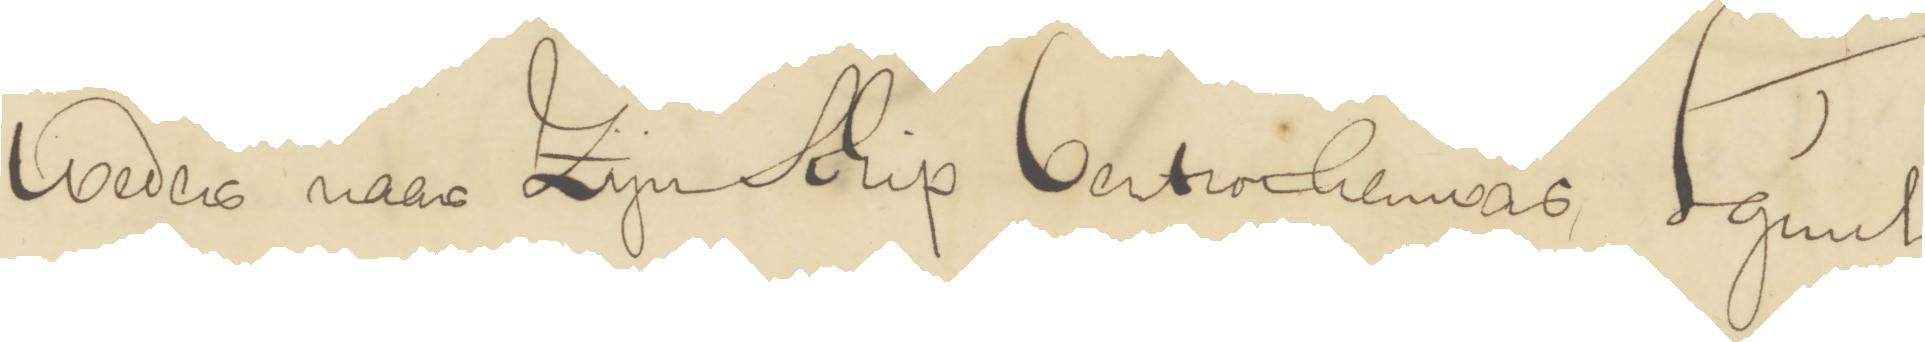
weder naar zijn schip vertrocken was t'gun
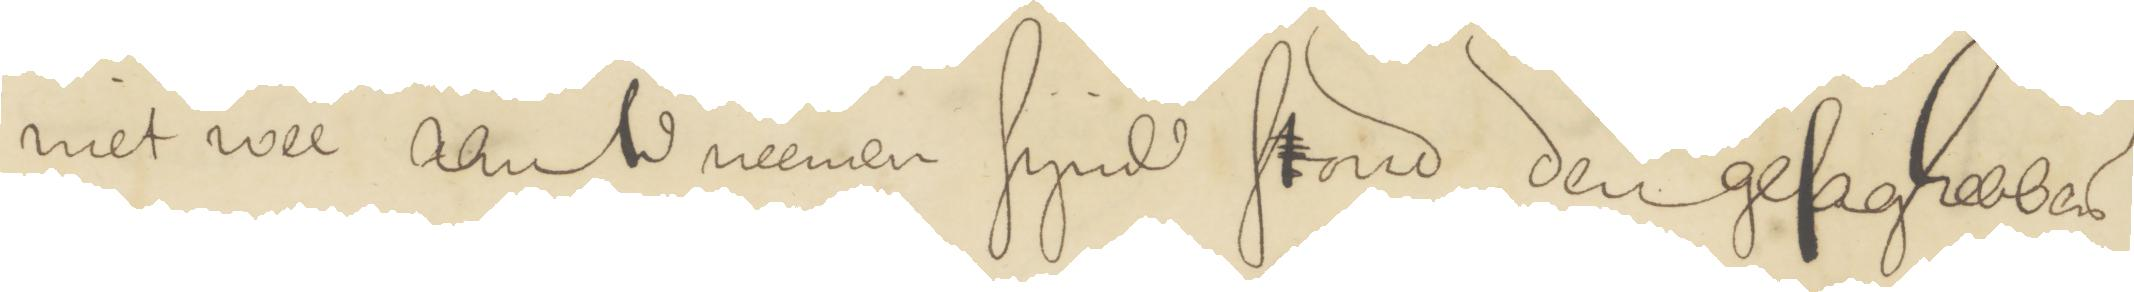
niet wel aan te neemen sijnde stond den gesaghebber
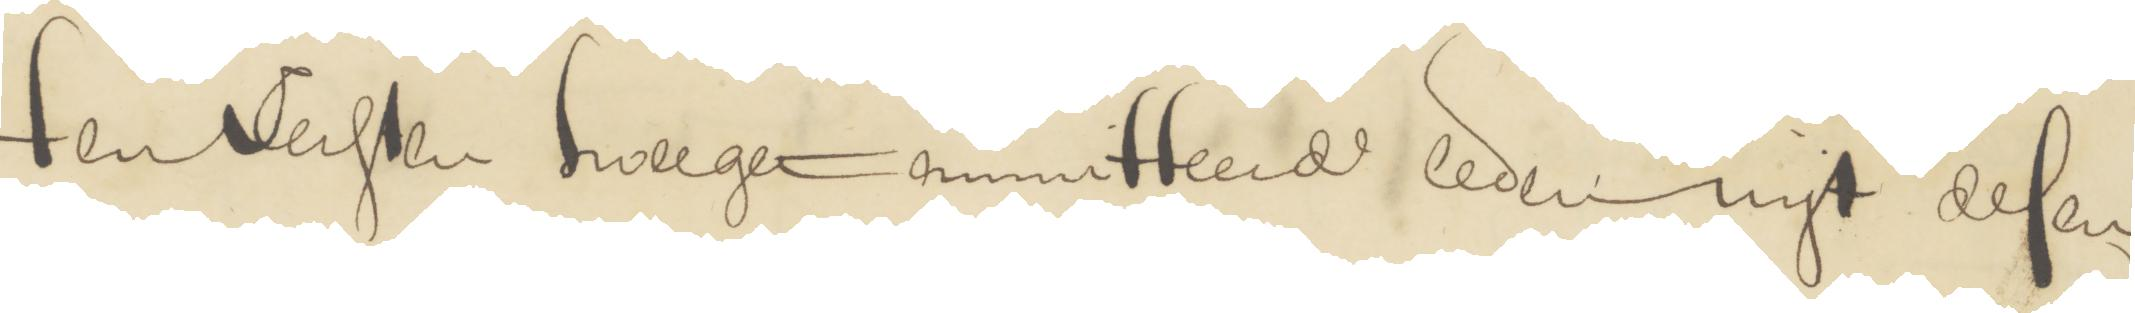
ten Eersten twee gecommitteerde leden uijt desen
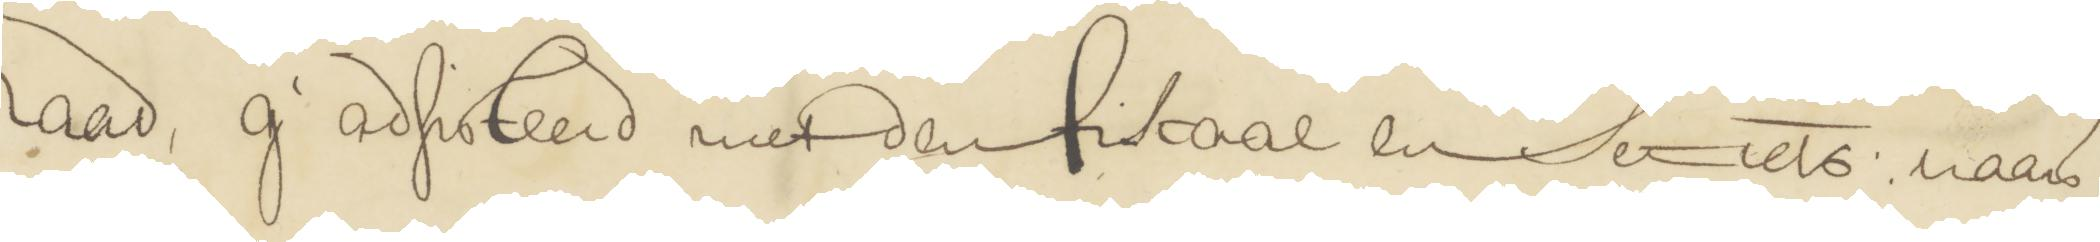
raad, g’adsisteerd met den fiscaal en secrets: naar
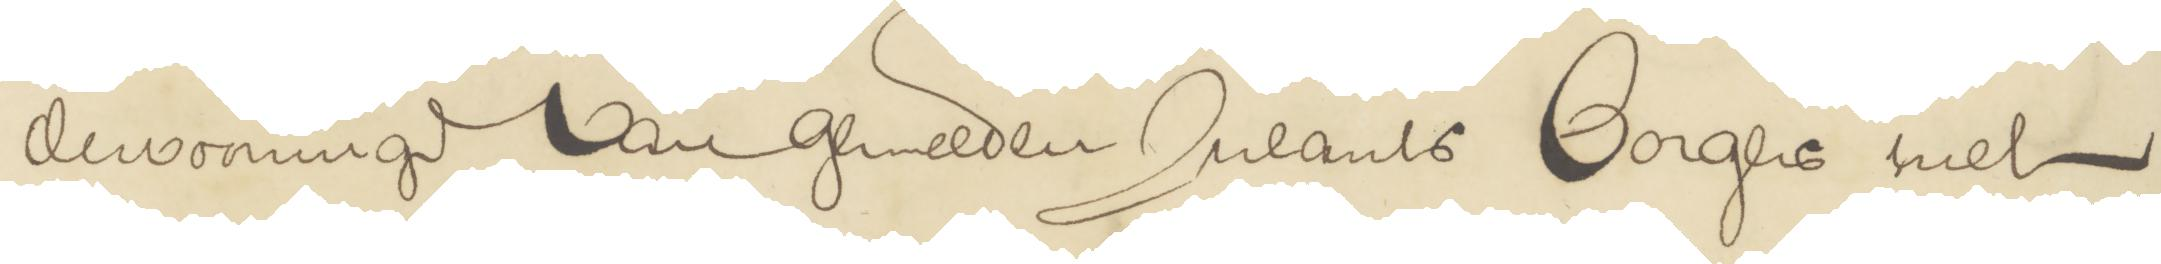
de wooninge van gemelden Jnlants borger met
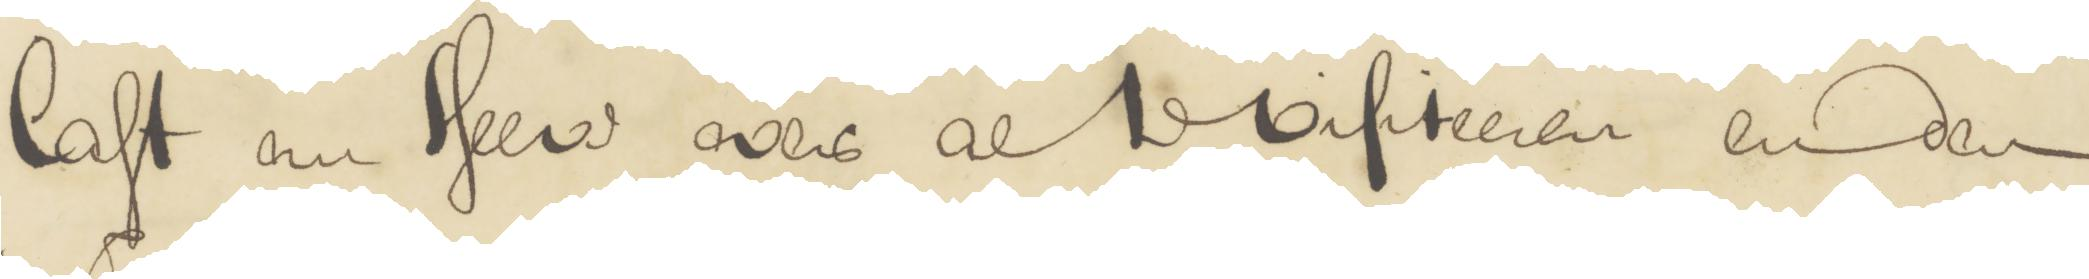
last om tselve over al te visiteeren en den
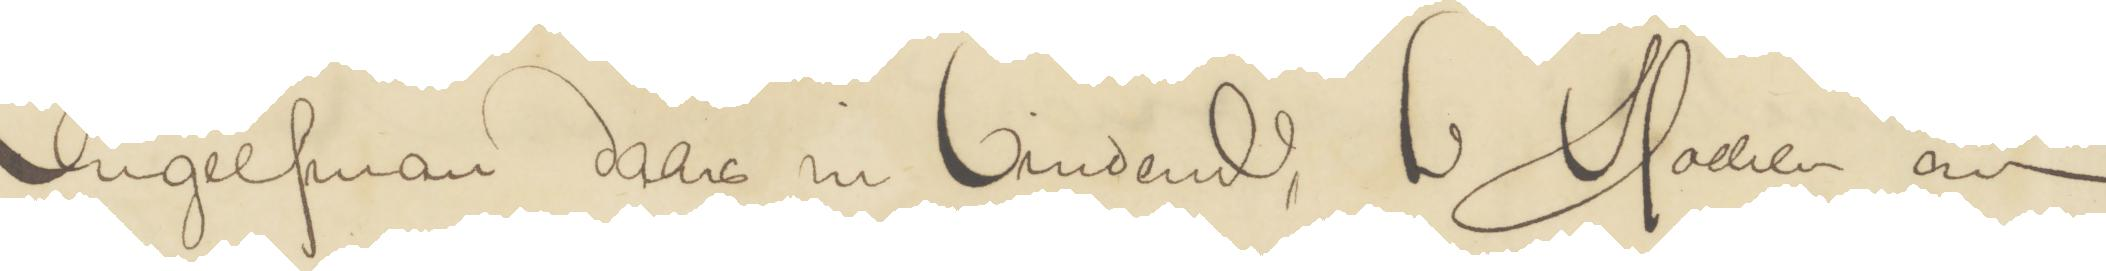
Engelsman daar in vindende, te versoeken om
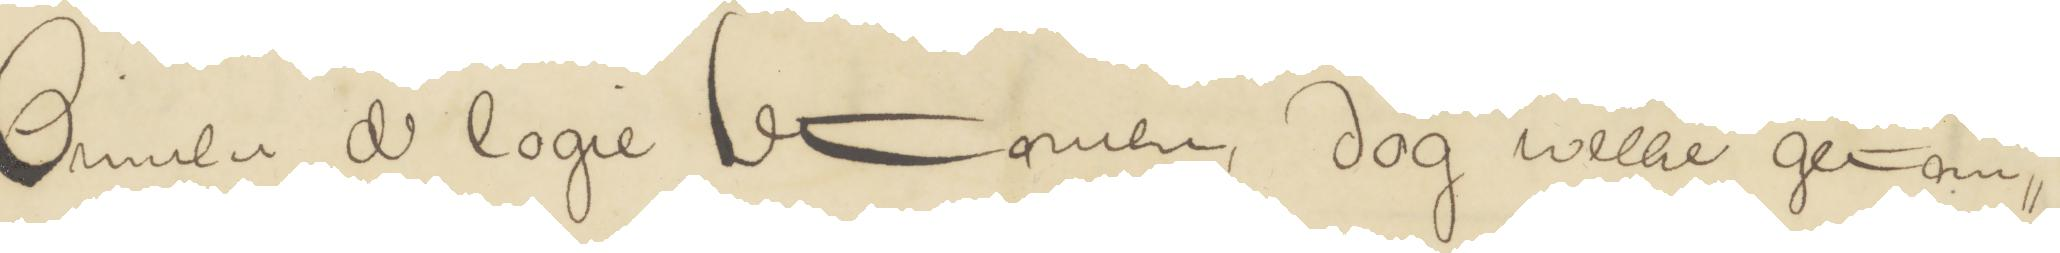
binnen de logie tecomen, dog welke gecom„
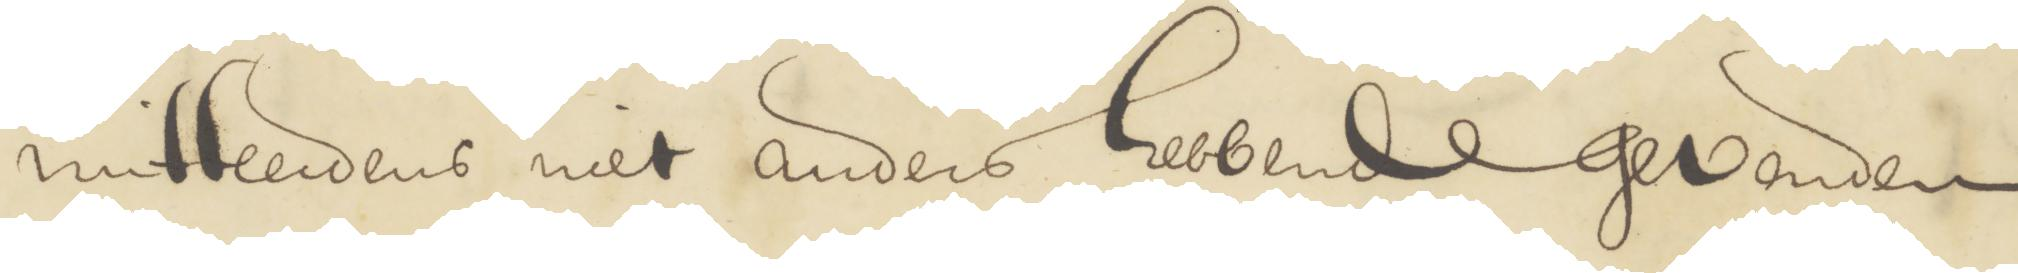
mitteerdens niet anders hebbende gevonden
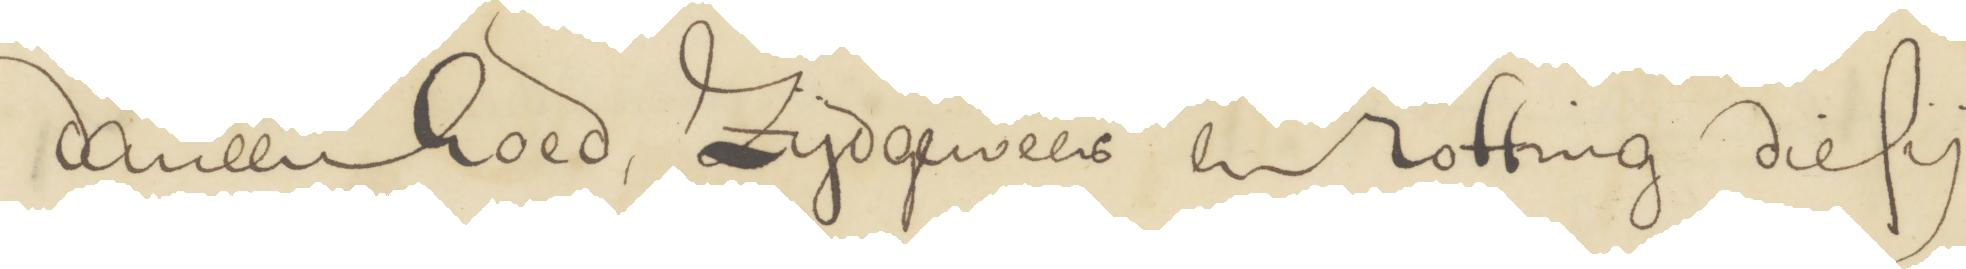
dan een hoed, zijdgeweer en rotting die sij
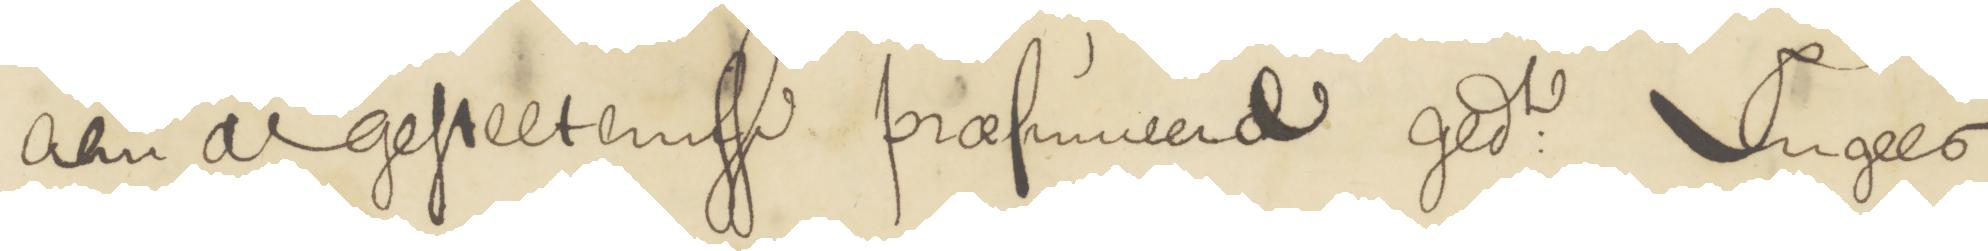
aan de gesteltenisse praesumeerde ged:te Engels
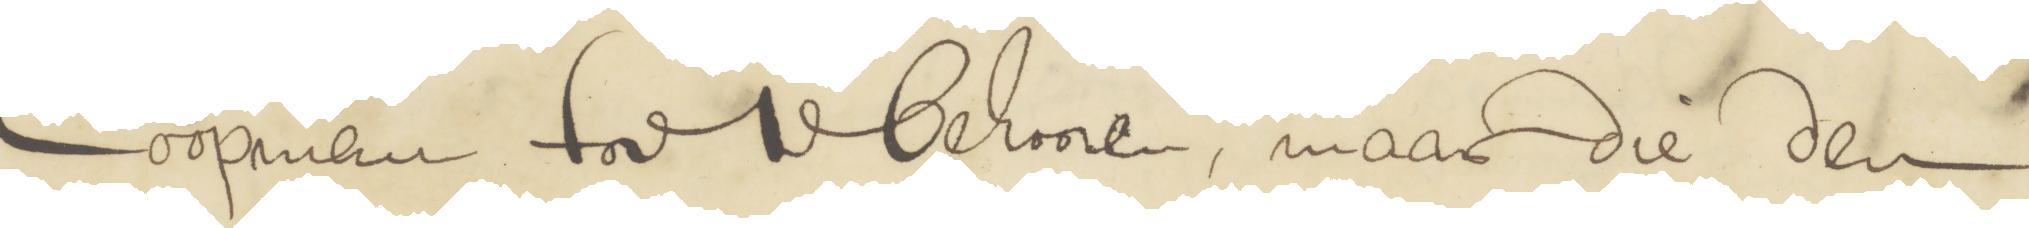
Coopman toe te behooren, maar die den
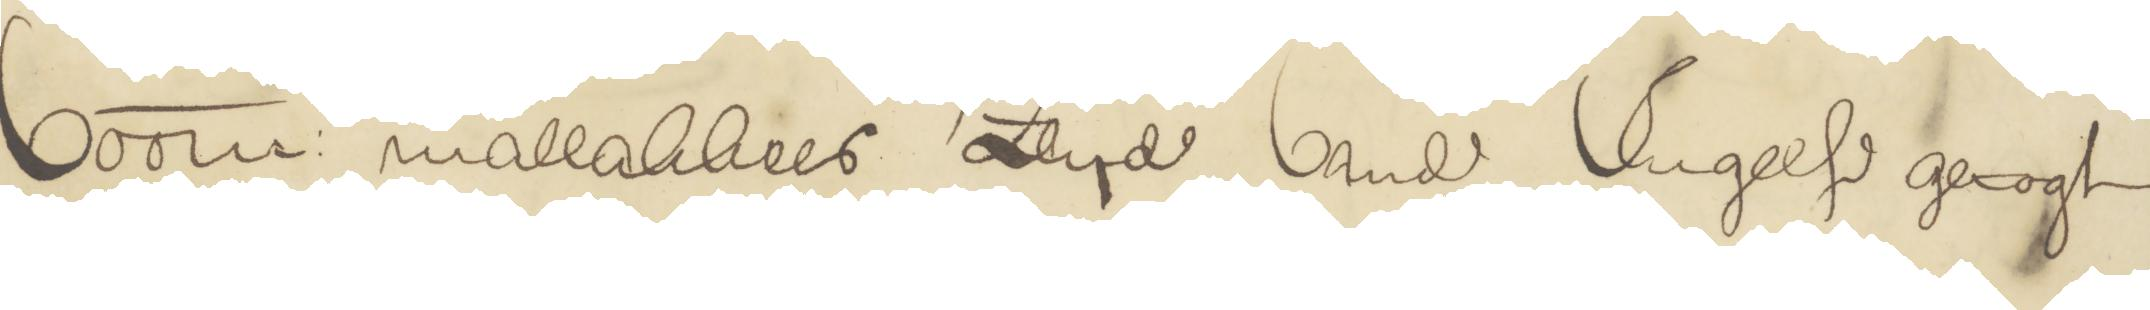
voorn: mallakkees zeijde vande Engelse gecogt
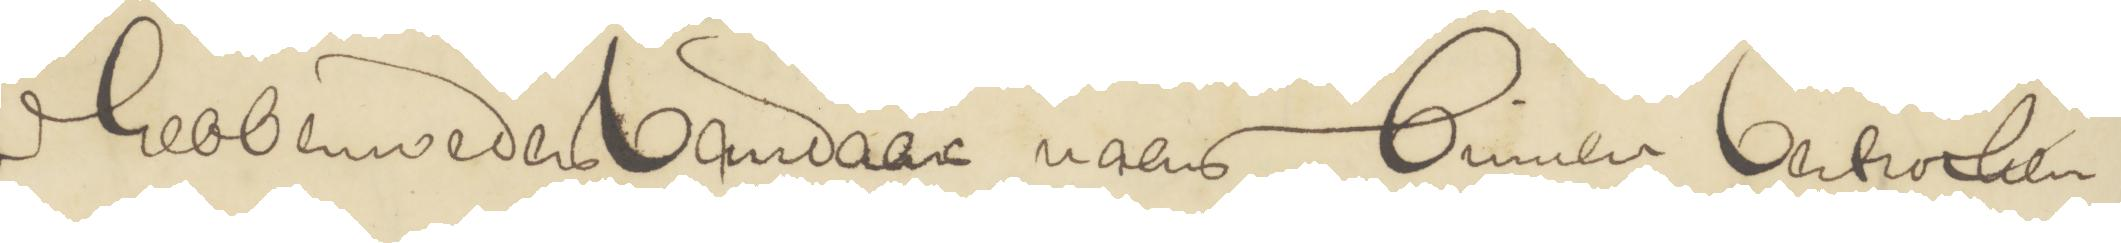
te hebben weder vandaar naar binnen vertrocken
